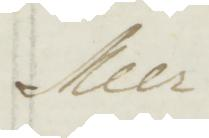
Meer
